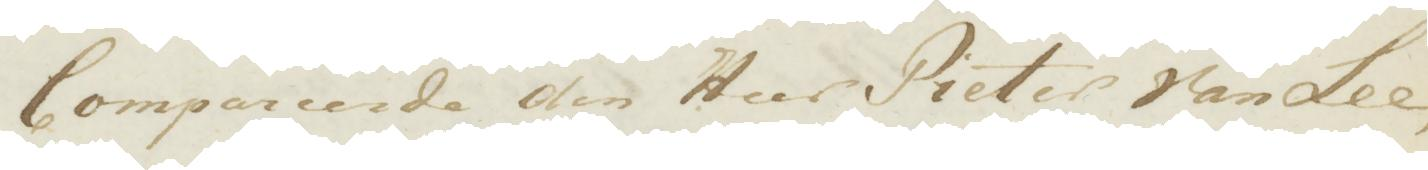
Compareerde den Heer Pieter van Lee,
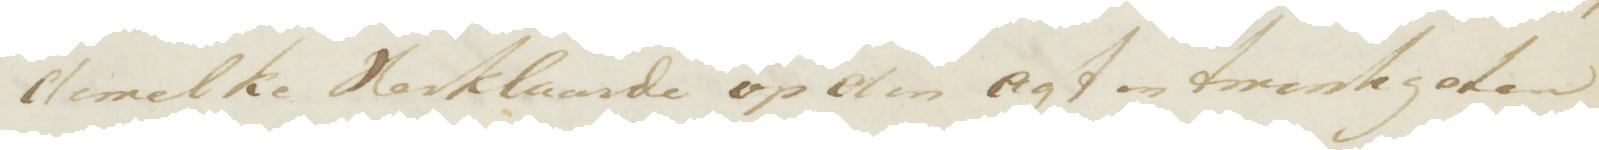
dewelke Verklaarde op den agt en twintigsten
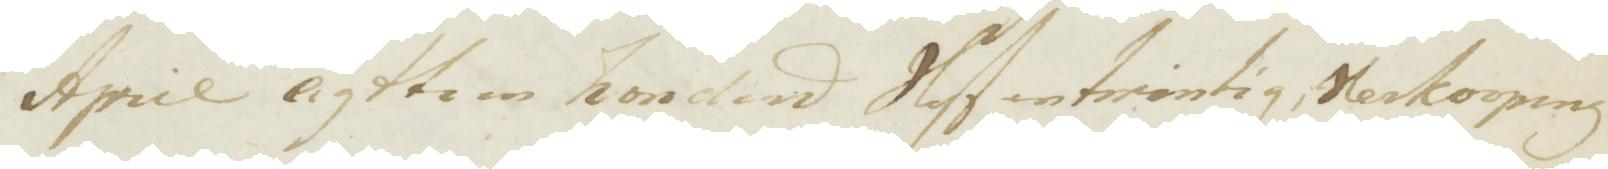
April agttien honderd Vyfentwintig, verkooping
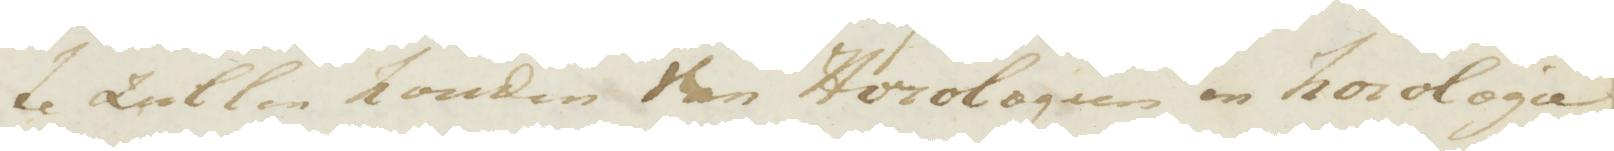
te zullen houden van Horologien en Horologie„
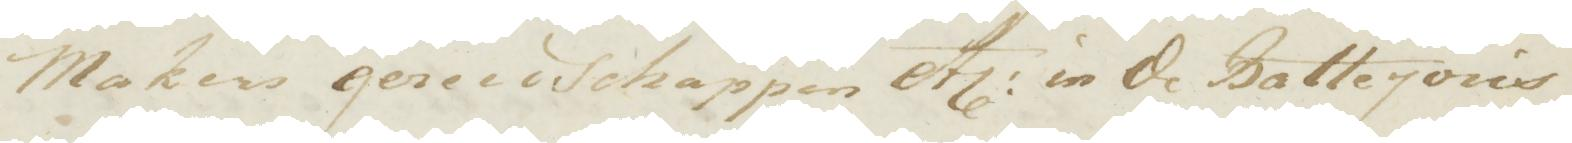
Makers gereedschappen etc: in de Battejouws
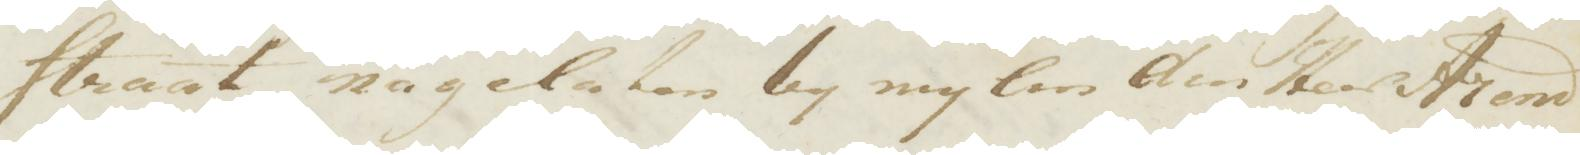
straat, nagelaten by my Een den Heer Arend
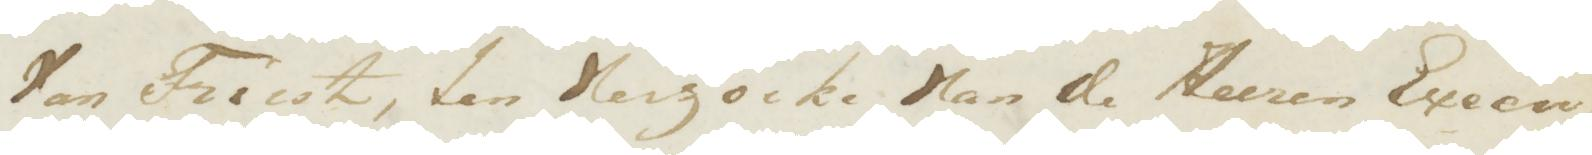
Van Friest, ten verzoeke van de Heeren Execu
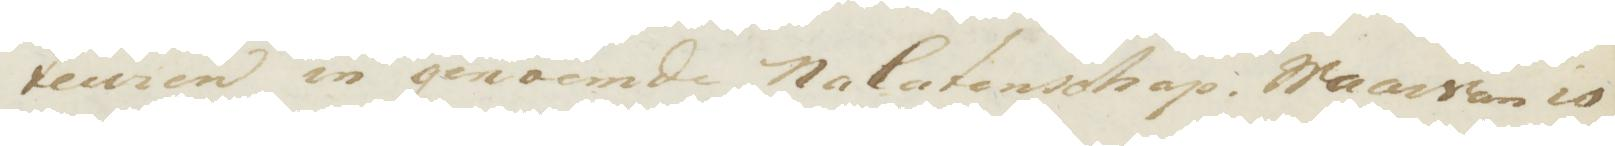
teuren in genoemde Nalatenschap, Waarvan is
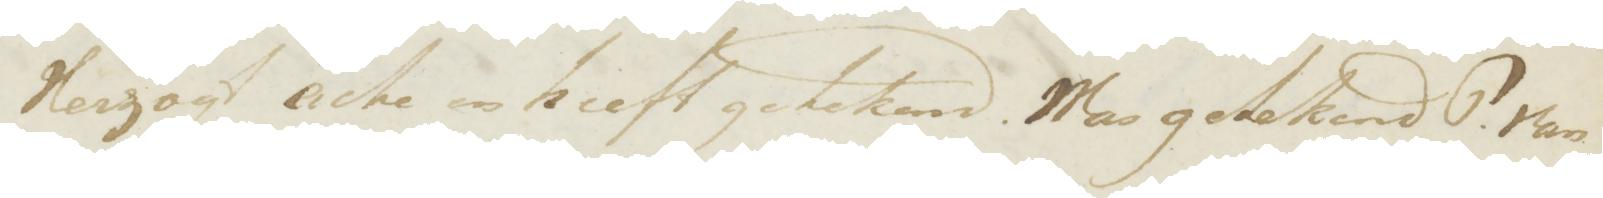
Verzogt acte en heeft getekend, Was getekend P: van
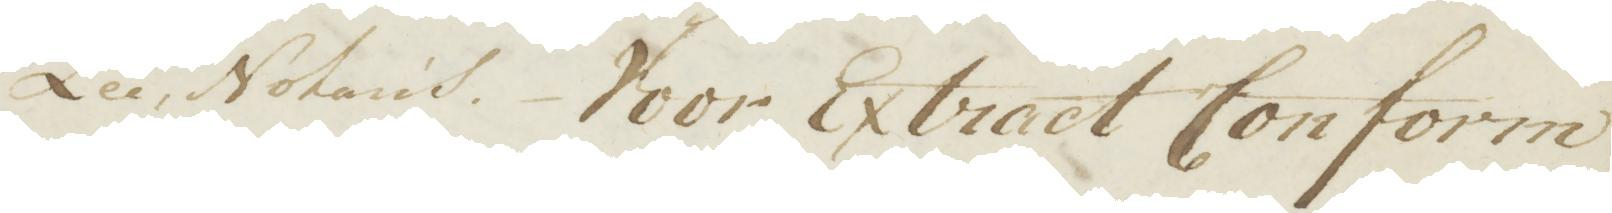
Lee, Notaris. Voor Extract Conform
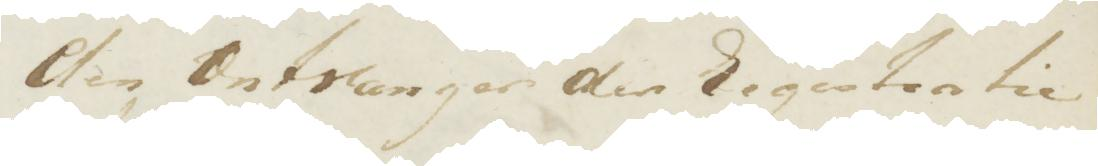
den, Ontvanger der registratie
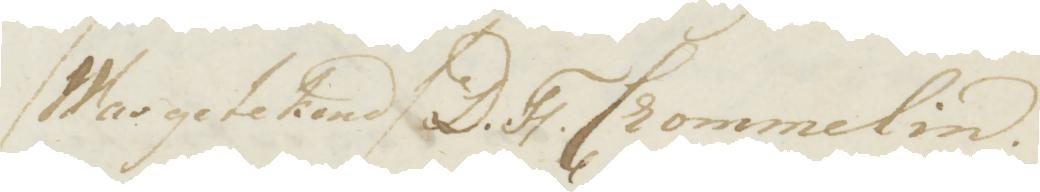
/Was getekend/ D:F: Crommelin.
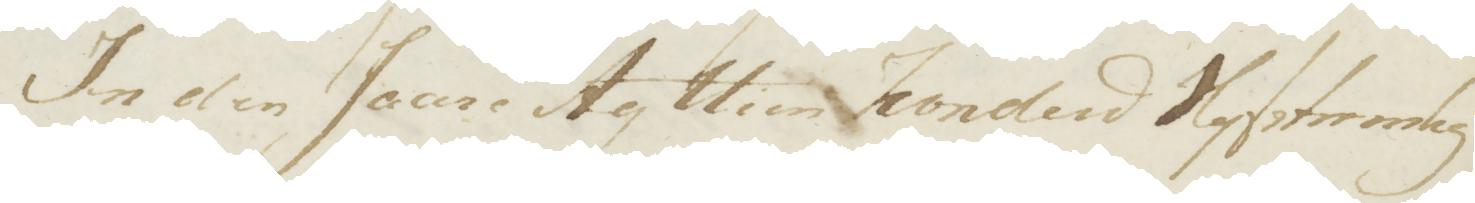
In den Jaare Agttien Honderd Vyfentwintig
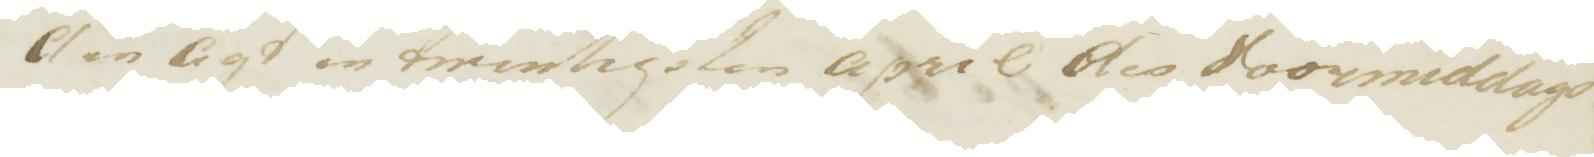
den agt en twintigsten april des voormiddags
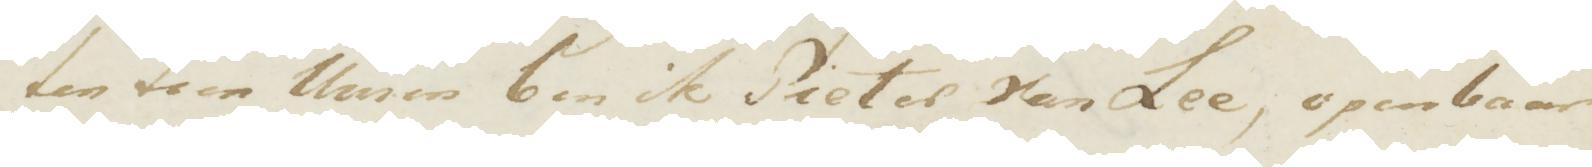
ten tien Uuren ben ik Pieter van Lee, openbaar
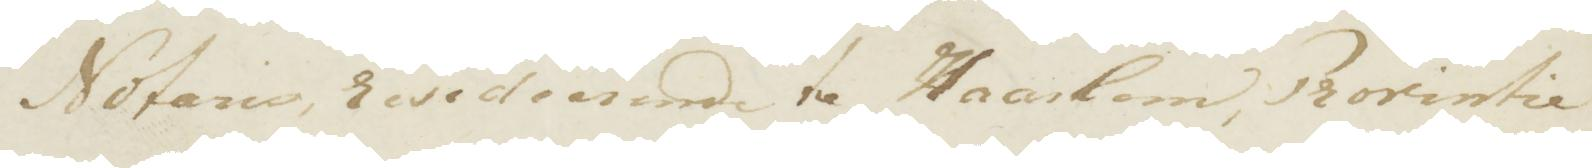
Notaris, resideerende te Haarlem, Provintie
